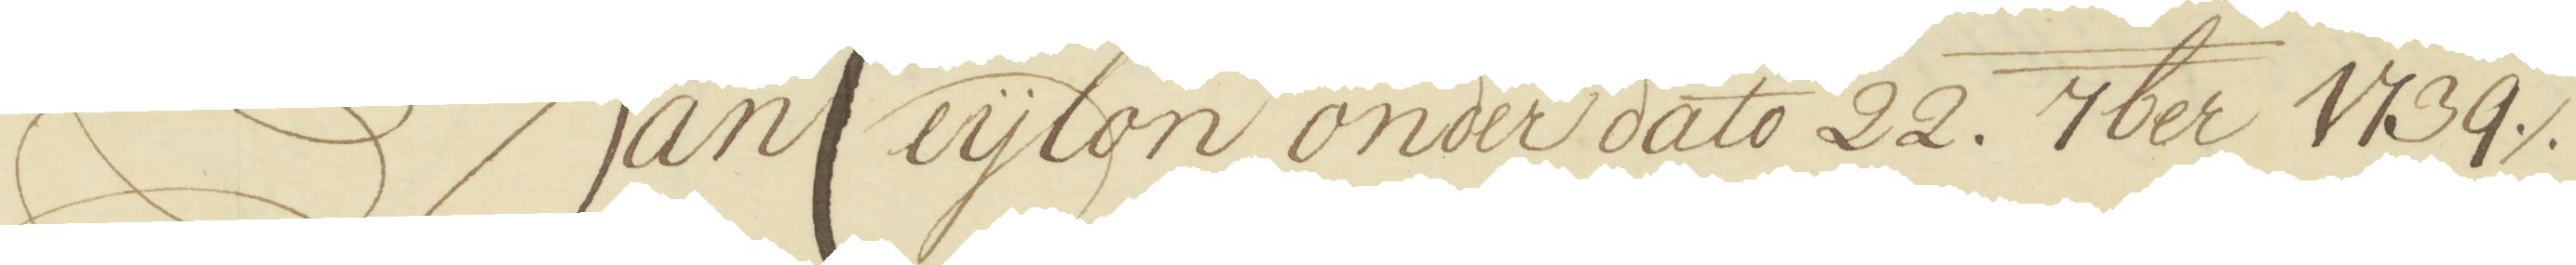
Van Ceijlon onder dato 22. 7ber 1734./.
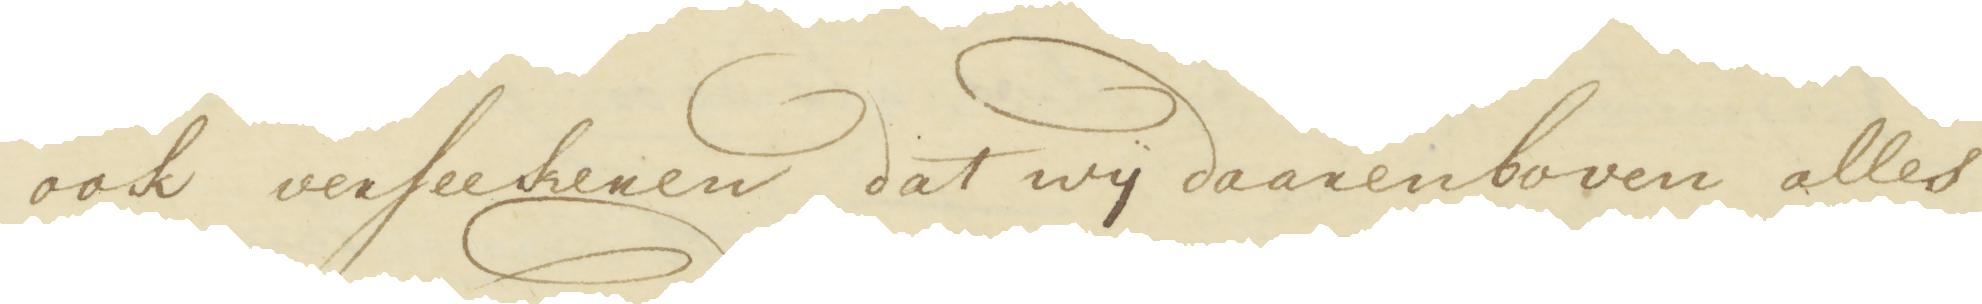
ook verseekeren dat wij daaren boven alles
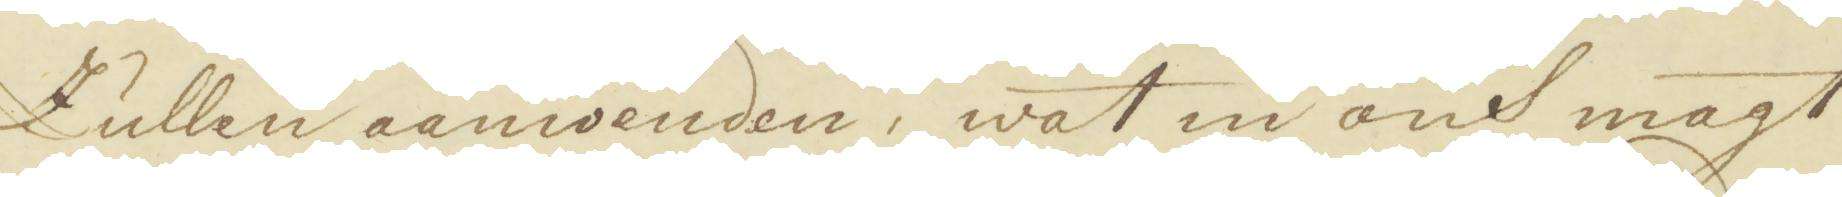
Zullen aanwenden, wat in ons magt
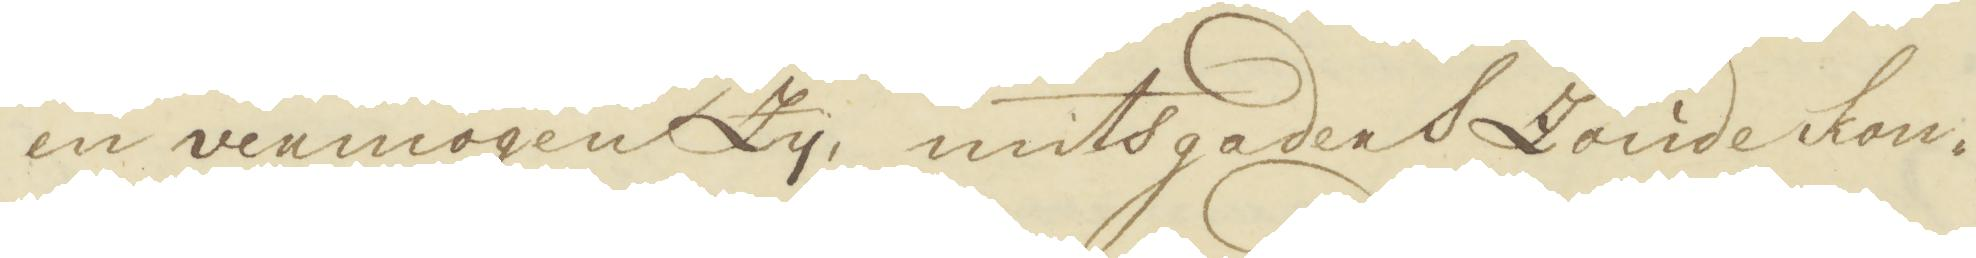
en vermogen Zij, mitsgaders Zoude kon„
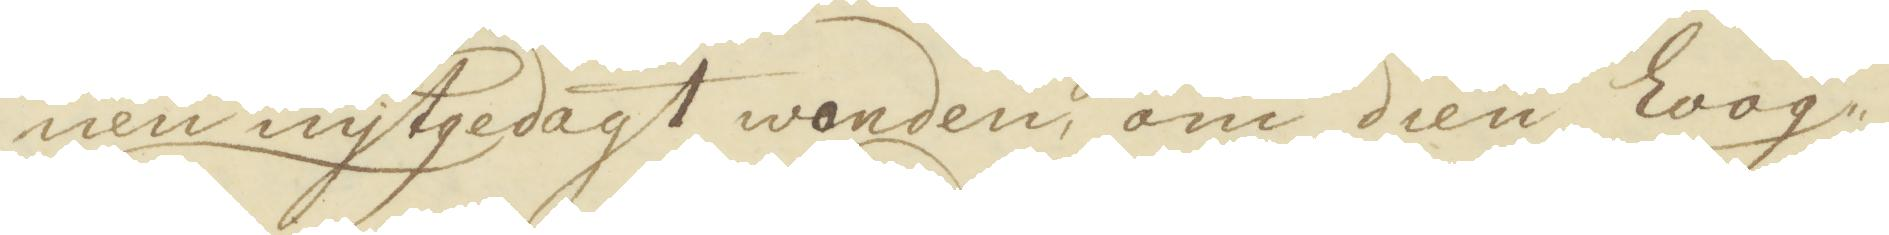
nen uijtgedagt worden; om dien hoog„
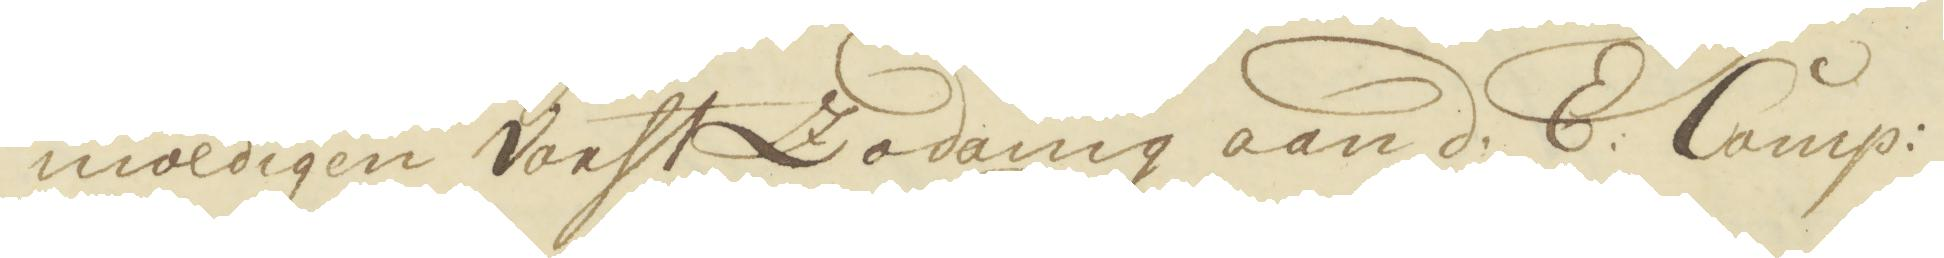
moedigen Vorst Zodanig aan d. E: Comp:
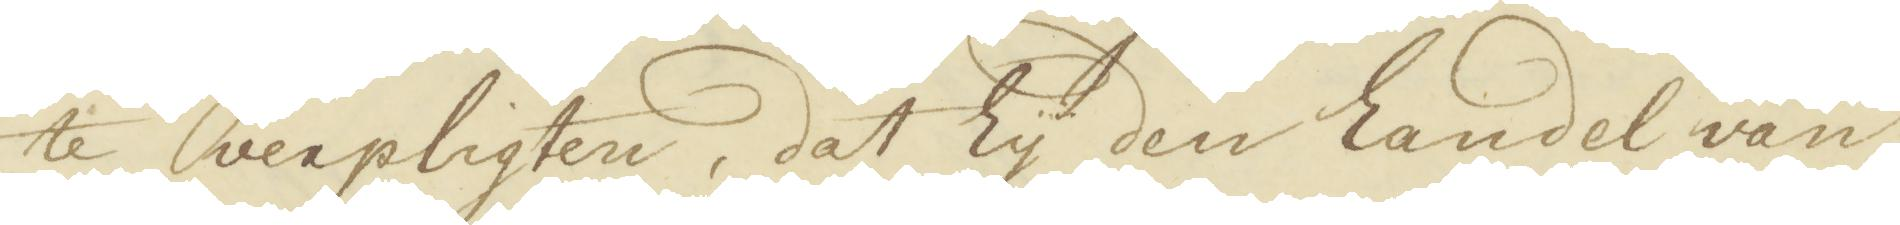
te verpligten, dat hij den handel van
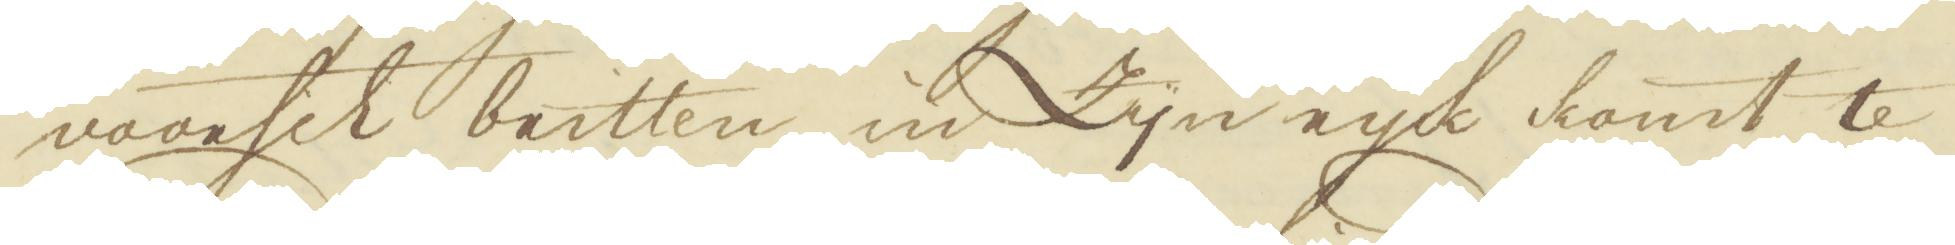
voorsch britten in Zijn rijk komt te
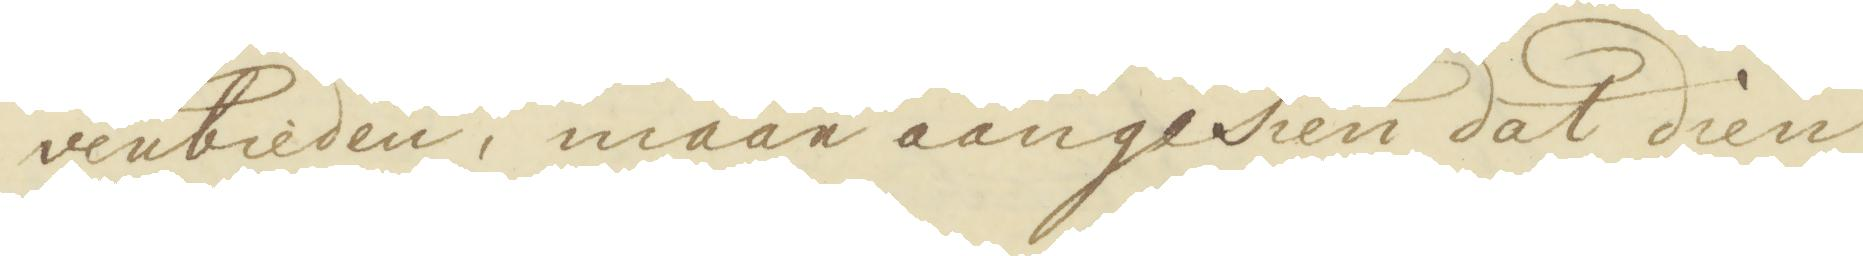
verbieden, maar aangesien dat dien
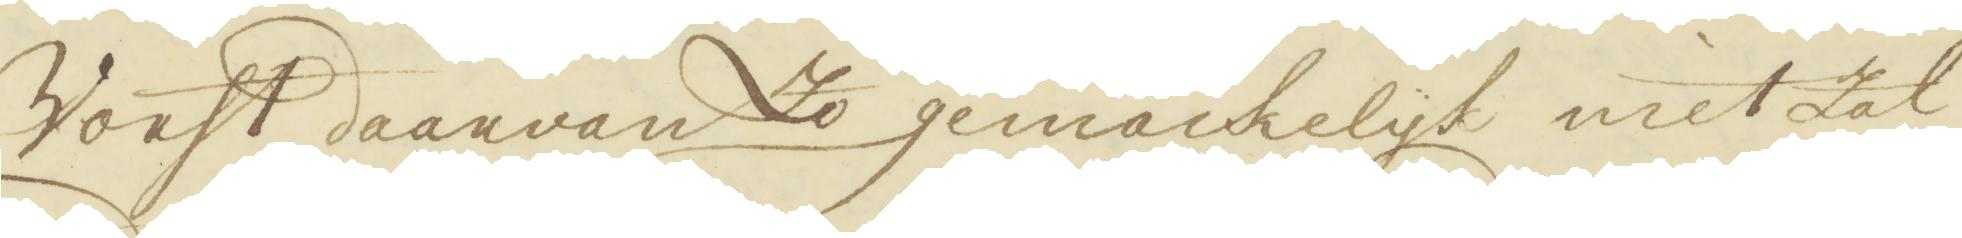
Vorst daarvan Zo gemackelijk niet Zal
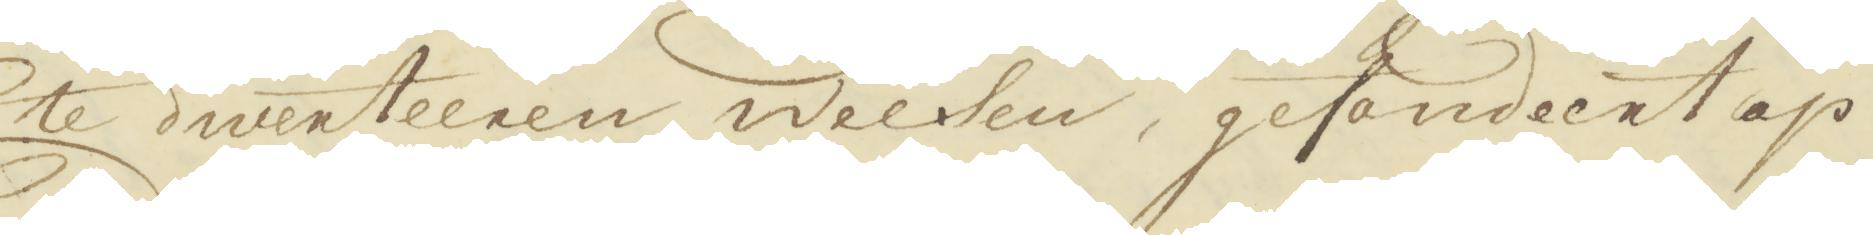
te diverteeren weesen, gesondeert op
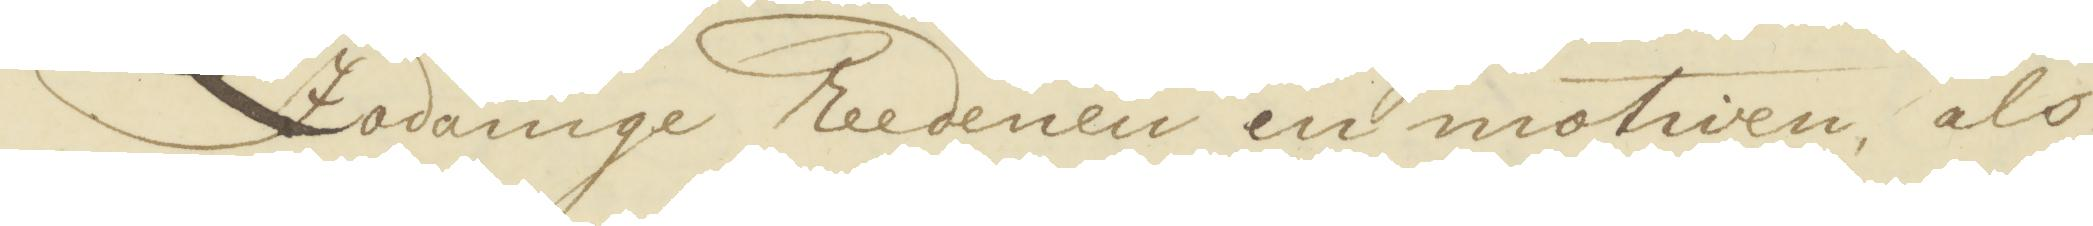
Zodanige reedenen en motiven, als
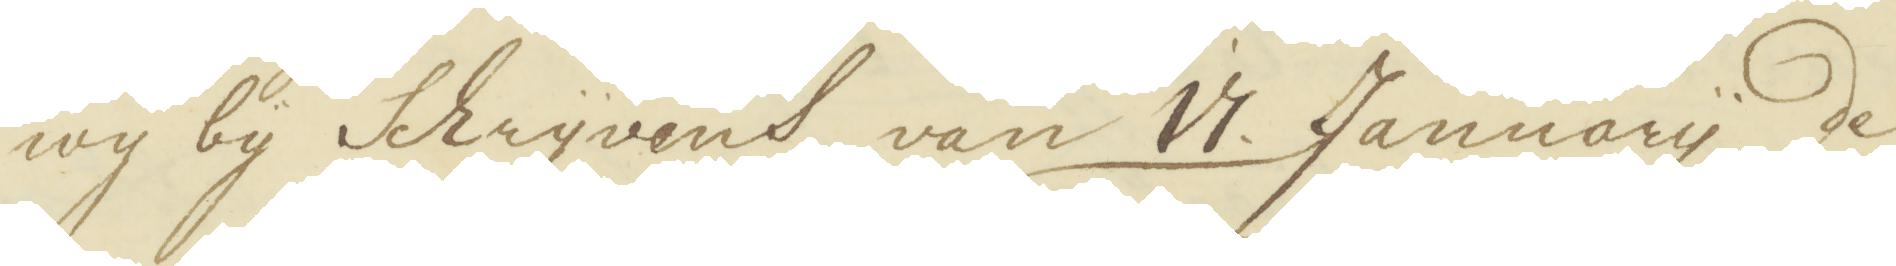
wij bij Schrijvens van 17. Januarij de
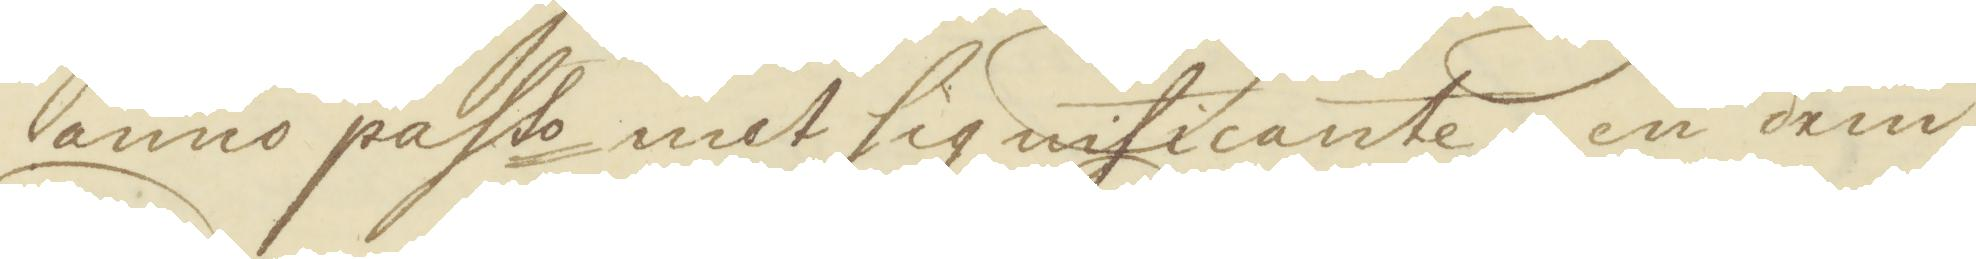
anno pass=o met Significante en drin
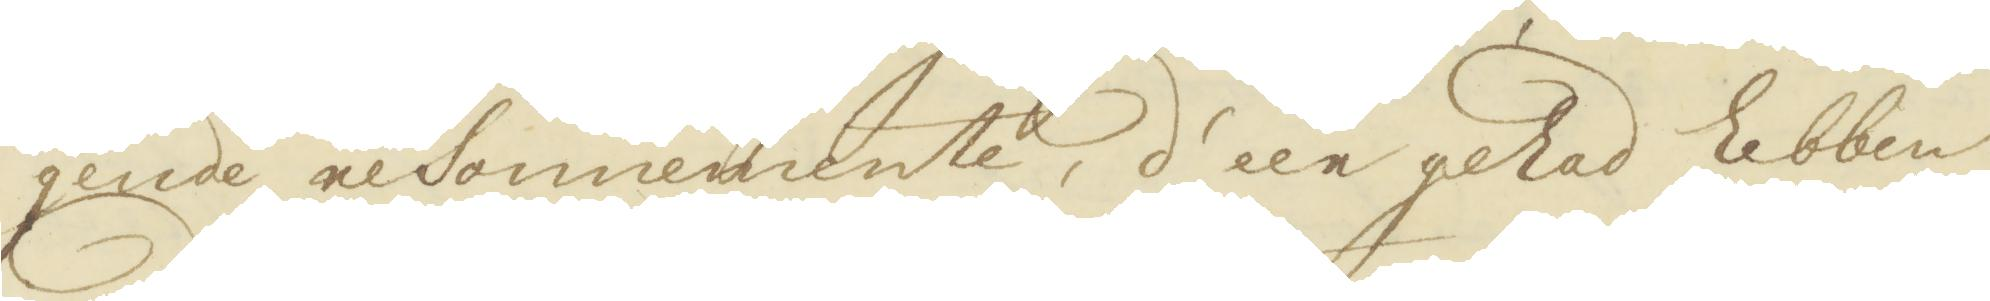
gende resonnemente, d’ eer gehad hebben
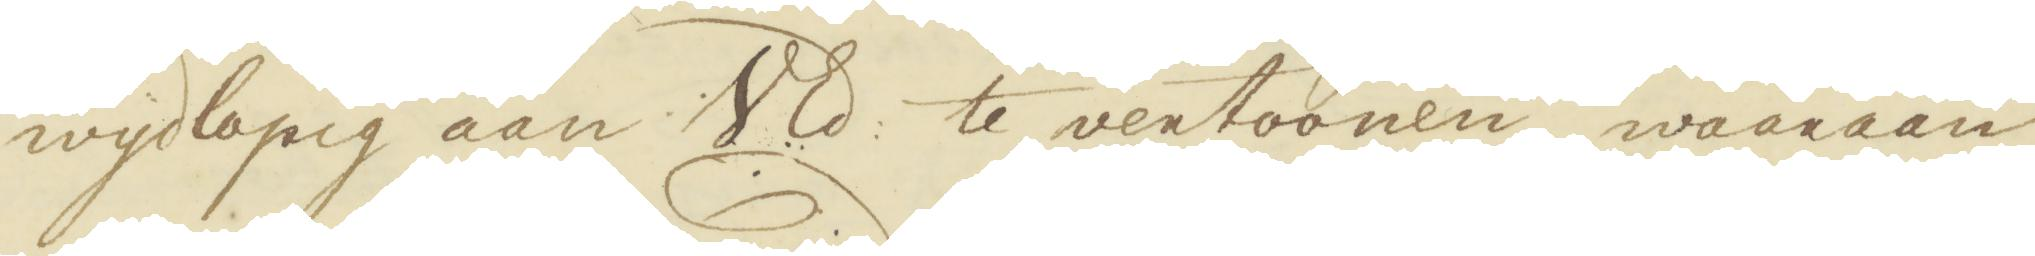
wijdlopig aan VEd: te vertoonen waaraan
